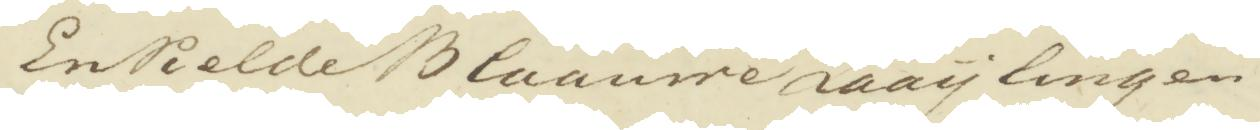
Enkelde Blaauwe Zaaijlingen
